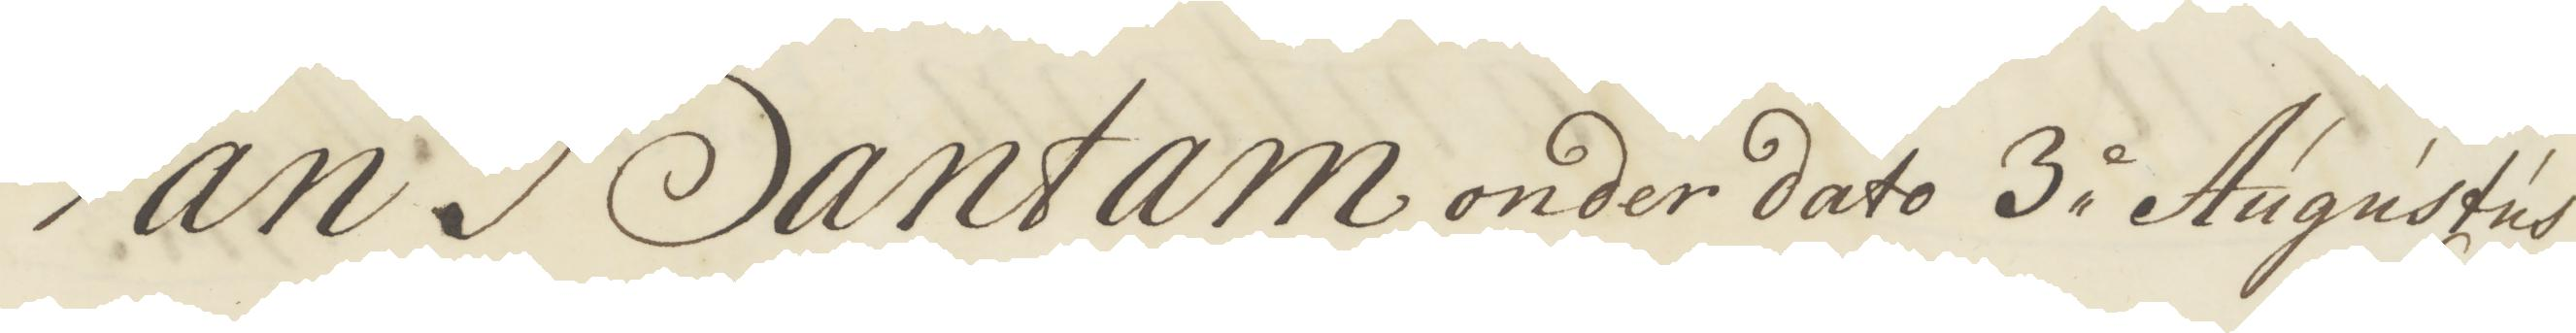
Van Bantam onder dato 3„e Augustus
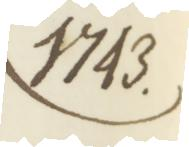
1743.
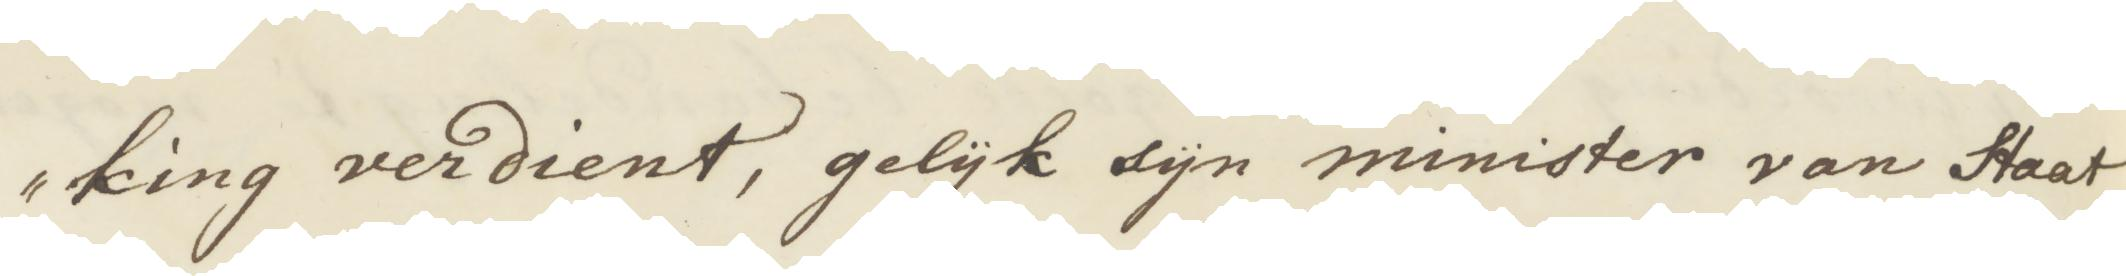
„king verdient, gelijk sijn minister van staat
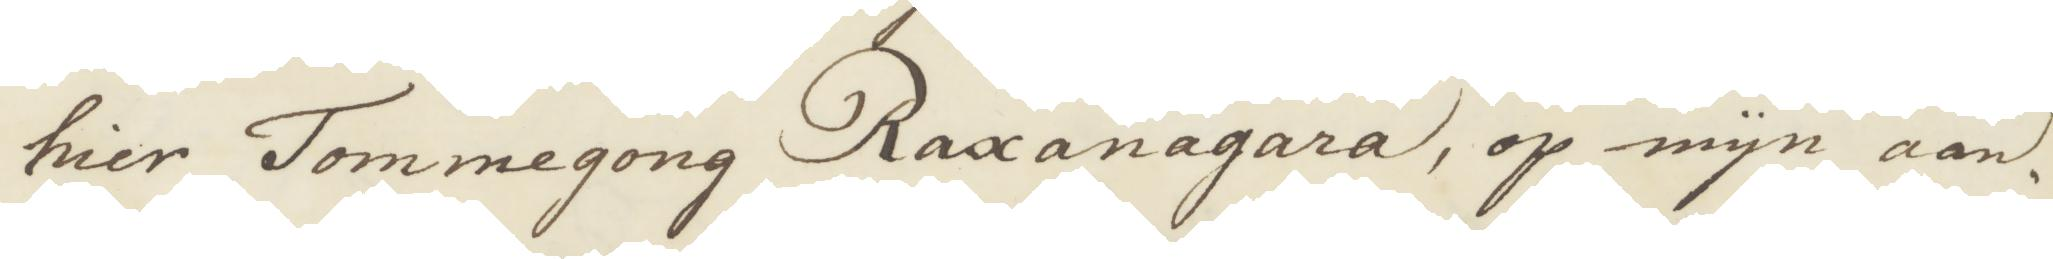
hier Tommegong Raxanagara, op mijn aan„
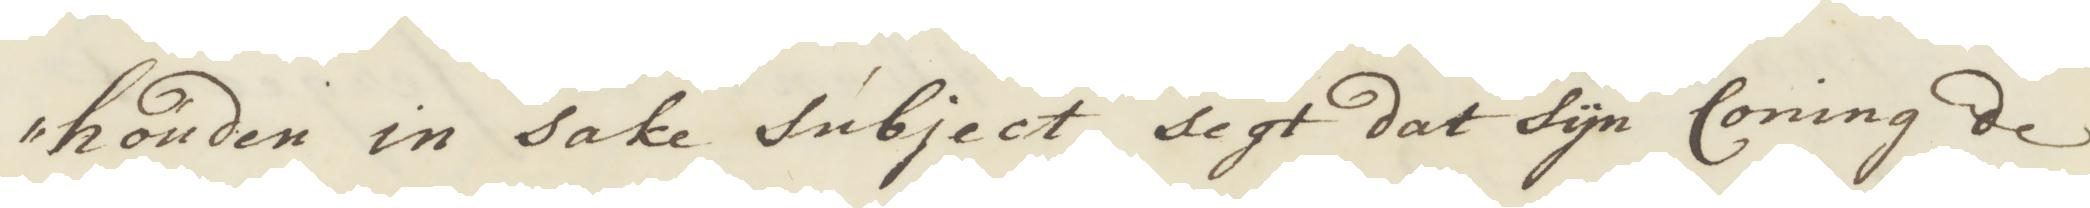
„houden in sake subject, segt dat sijn Coning de
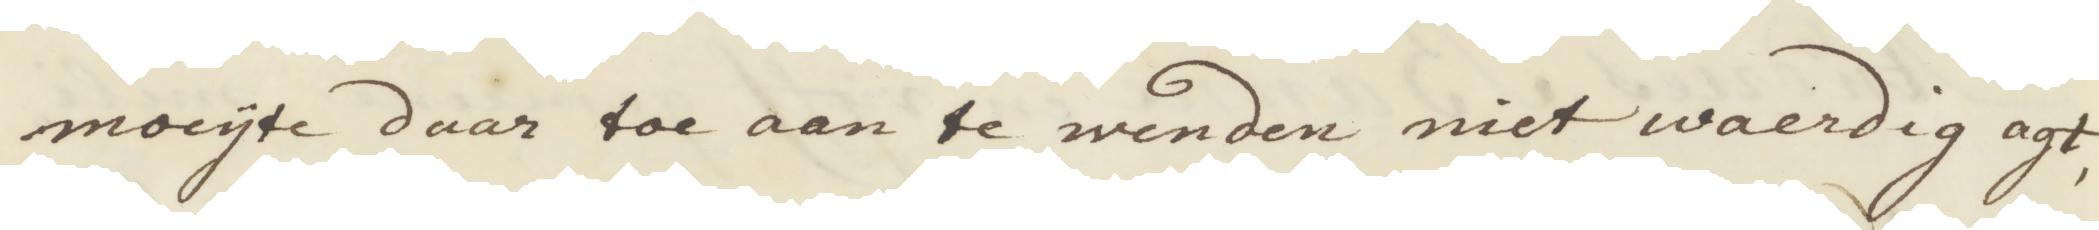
moeijte daar toe aan te wenden niet waerdig agt,
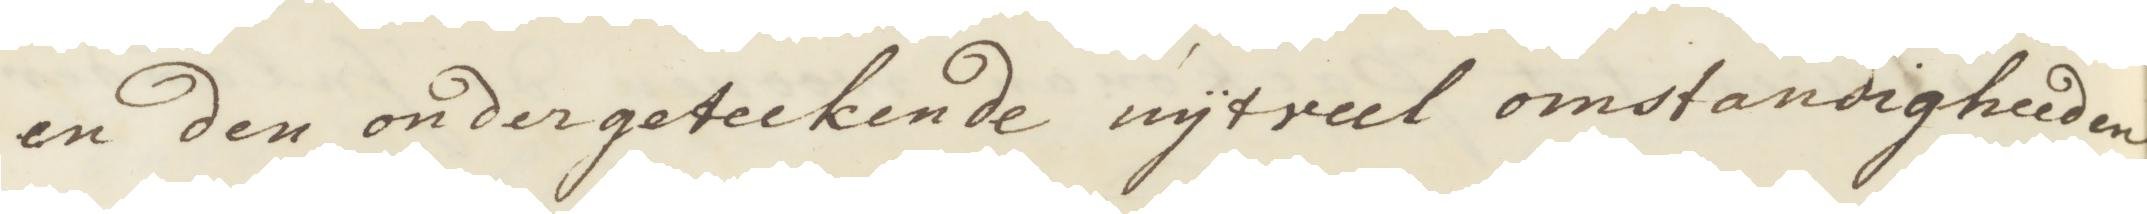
en den ondergeteekende uijt veel omstandigheeden
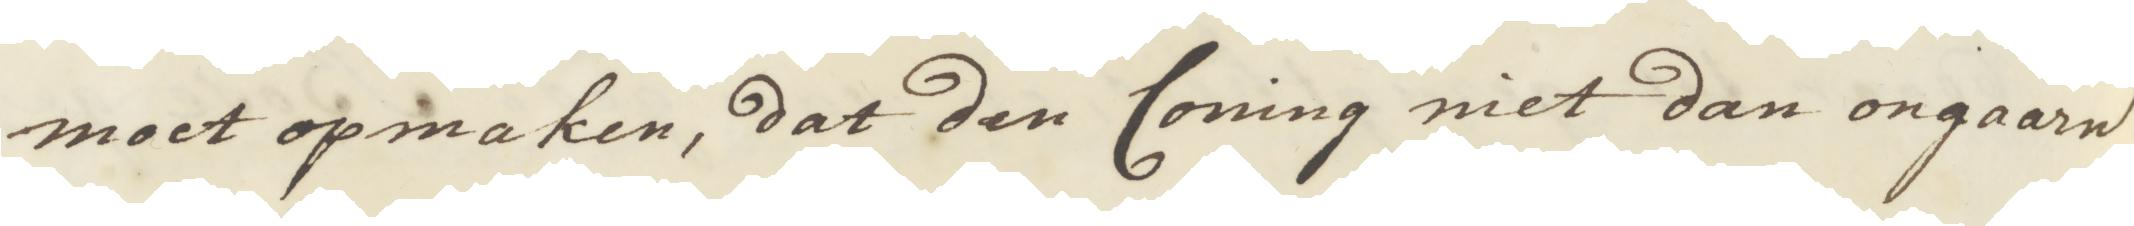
moet opmaken, dat den Coning niet dan ongaarn
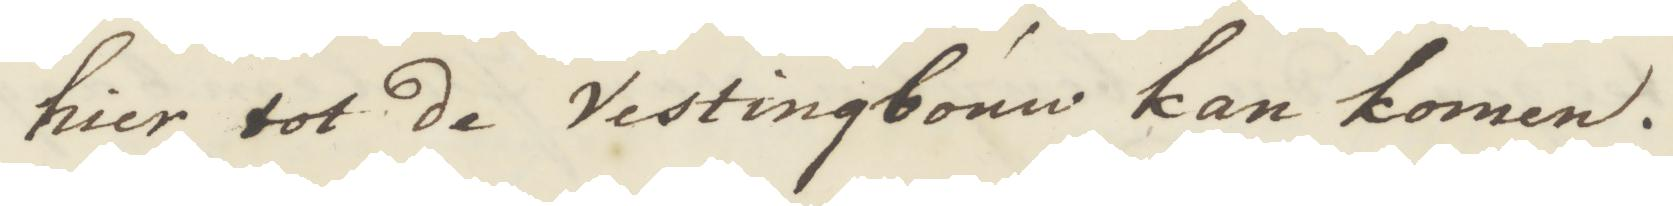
hier tot de vestingbouw kan komen.
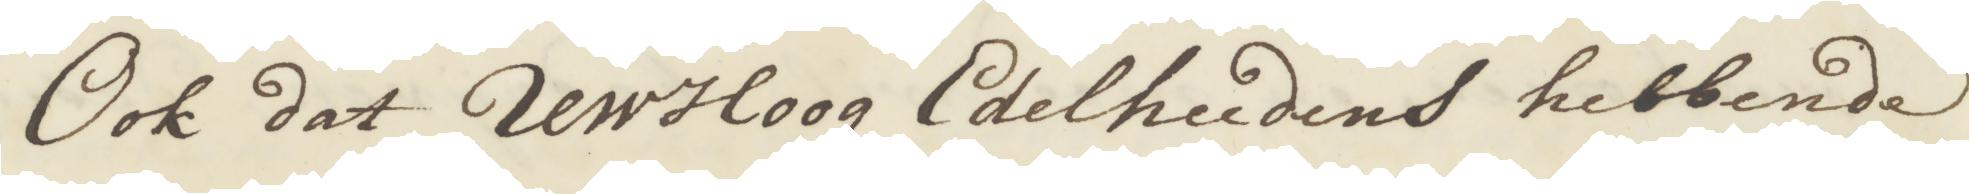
Ook dat UWHoog Edelheedens hebbende
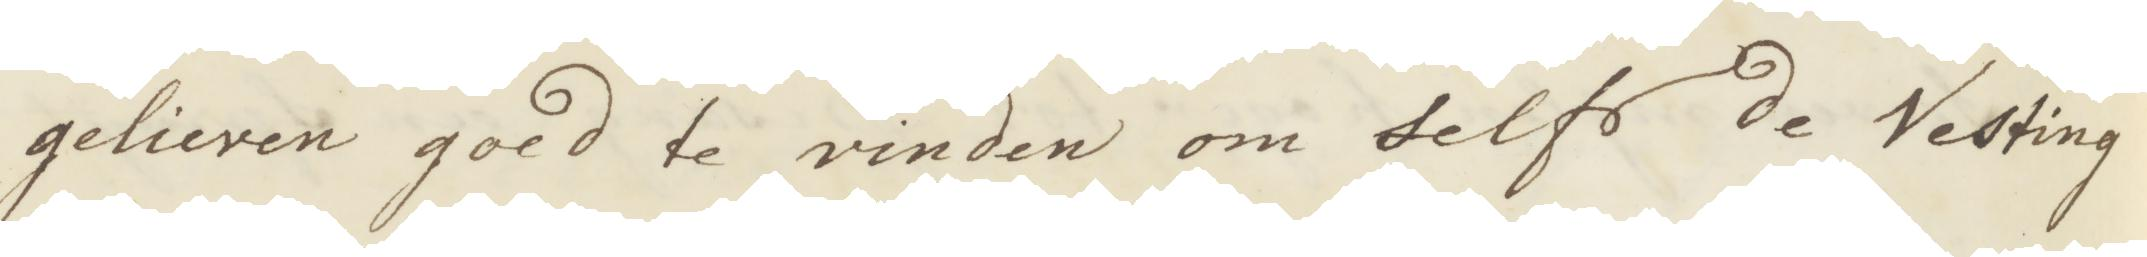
gelieven goed te vinden om selfs de Vesting
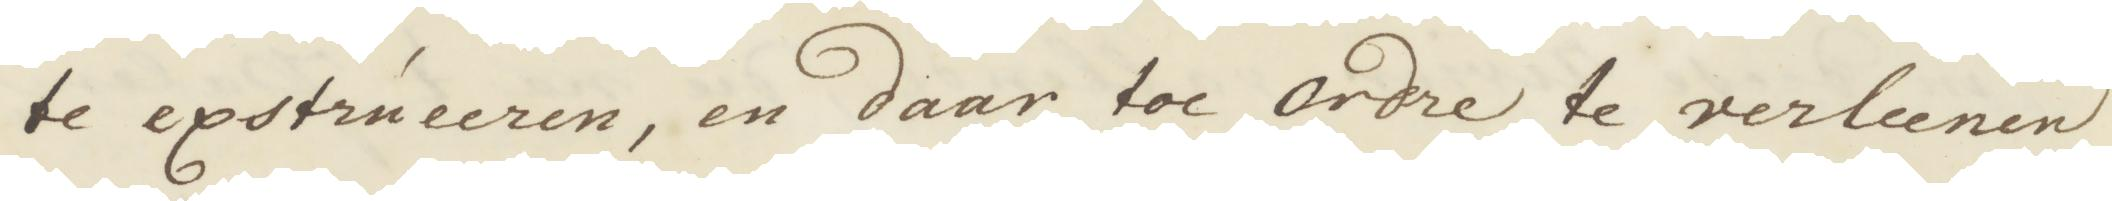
te exstrueeren, en daar toe ordre te verleenen
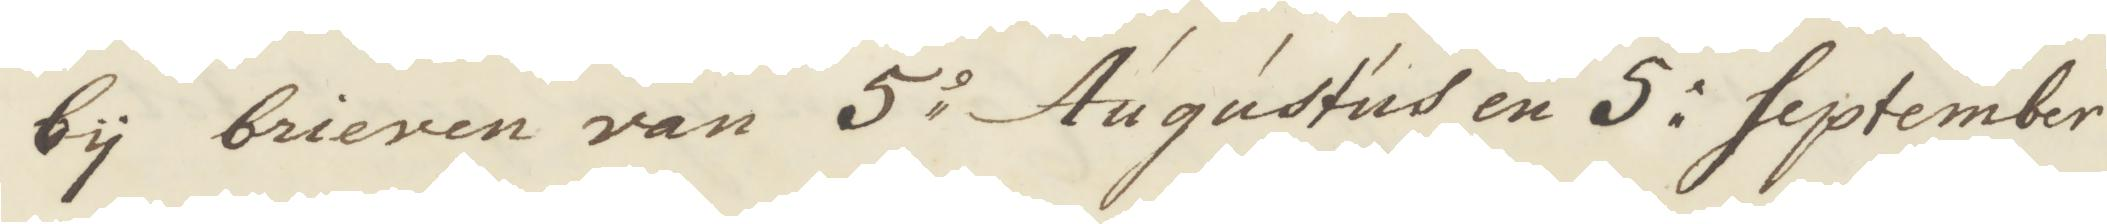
bij brieven van 5„e Augustus en 5„e september
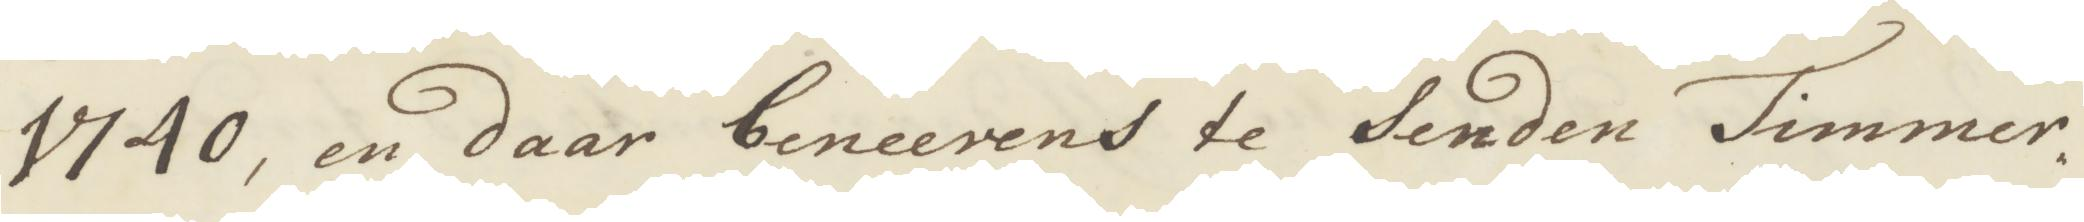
1740, en daar beneevens te senden Timmer„
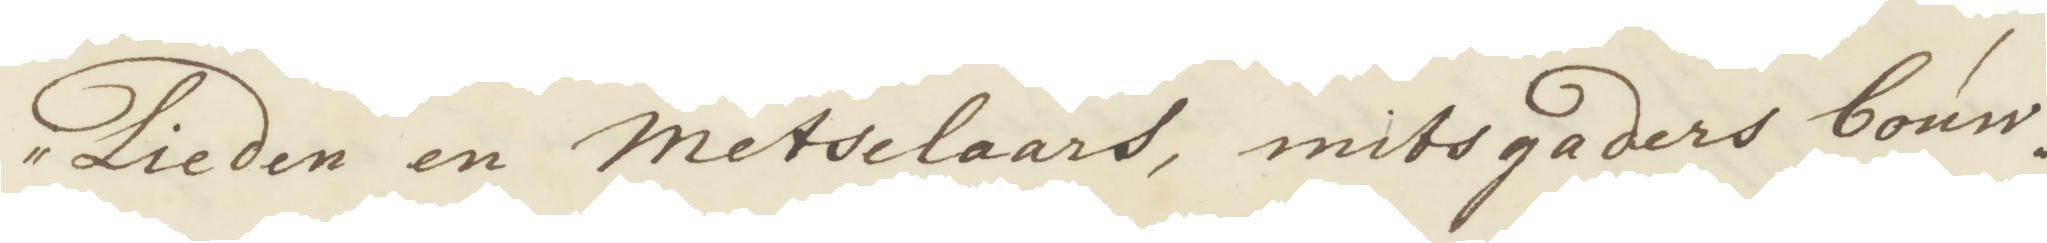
„lieden en metselaars, mitsgaders bouw„
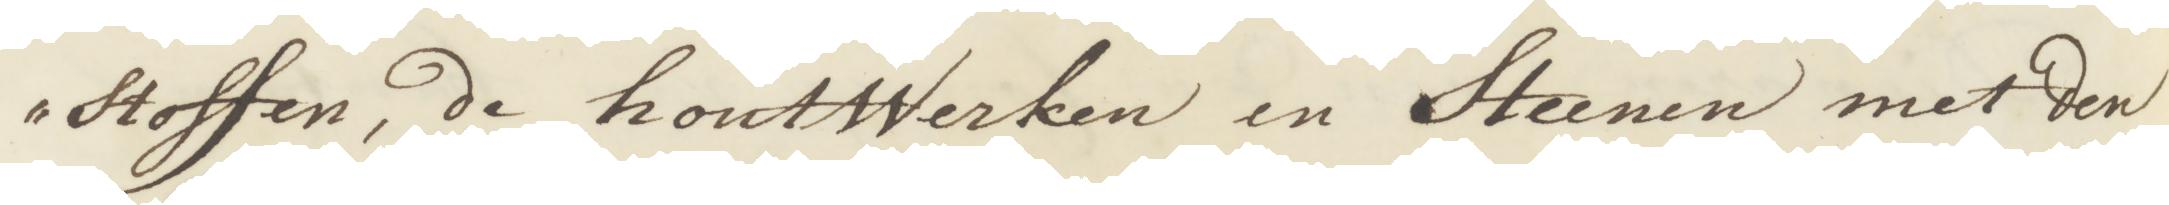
„stoffen, de houtwerken en steenen met den
